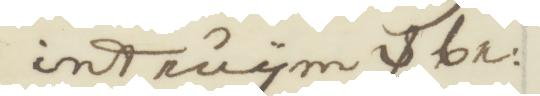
int ruijm verbr:
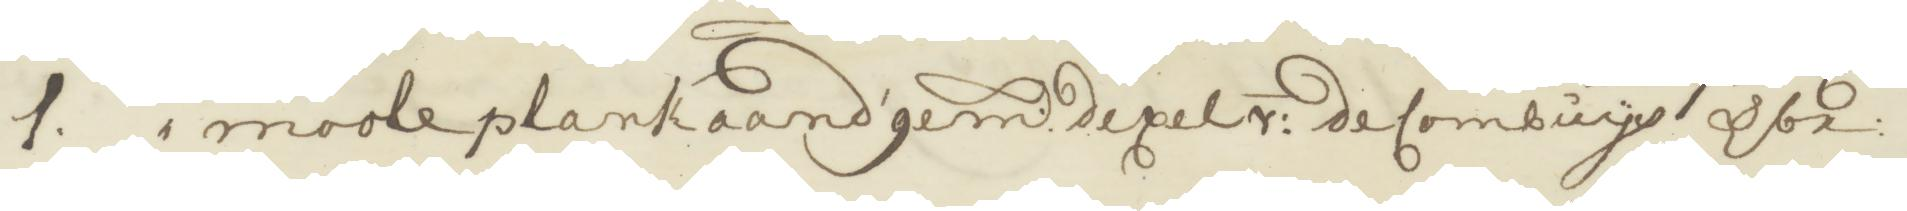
1. „ moole plank aand' gem: dexel v: de combuijs verbr:
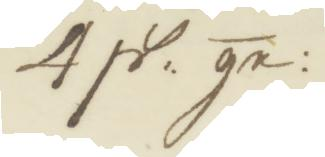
4 p:s gr:
